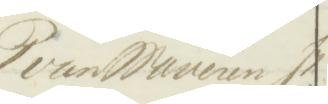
P vanWaveren Jr
